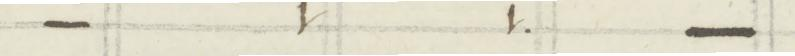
— 1 1. —
